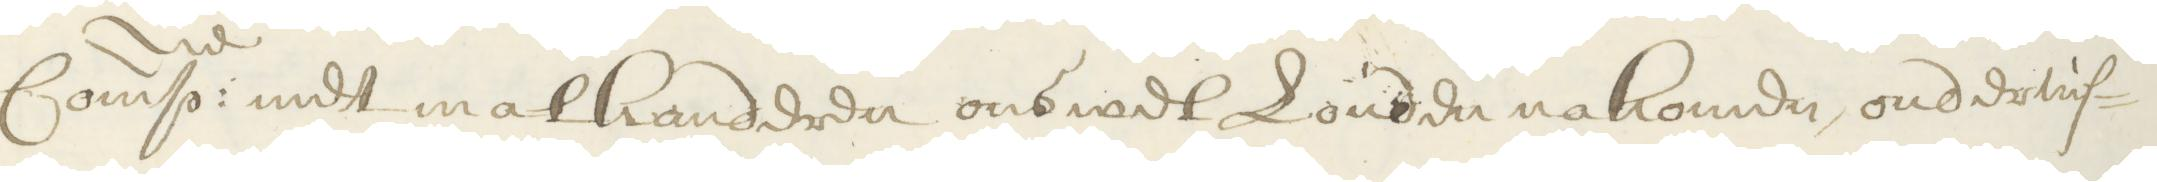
Comp:e met malkanderen ons wel zouden nakomen, ondertus=
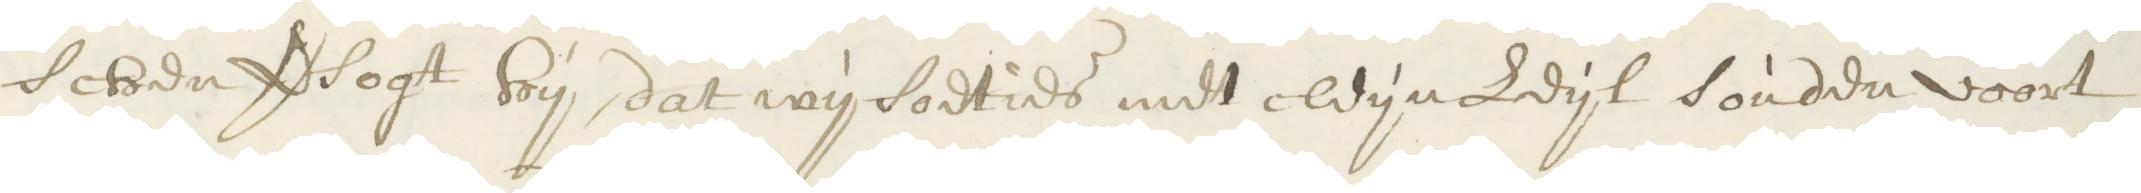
schen versogt hij, dat wij soeties met cleijn zeijl souden voort
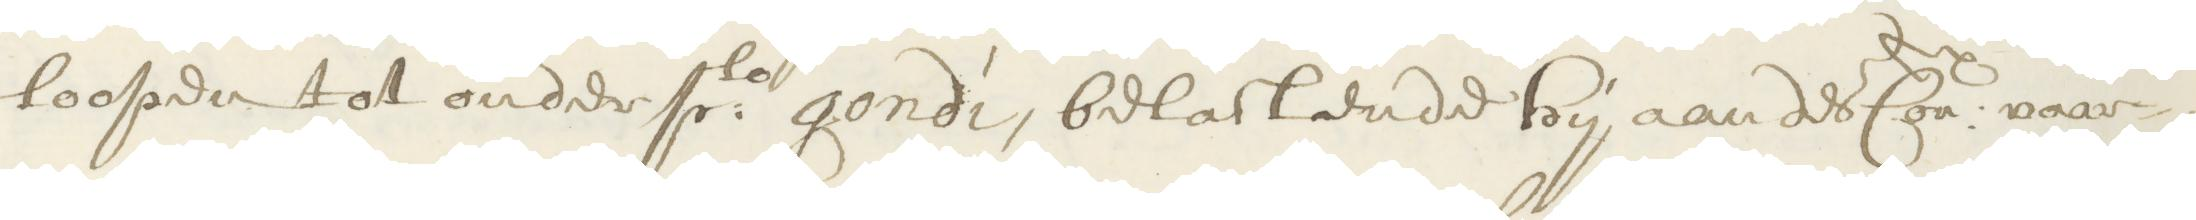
loopen tot onder p:lo gondi, belastende hij aan des Con:x vaar=
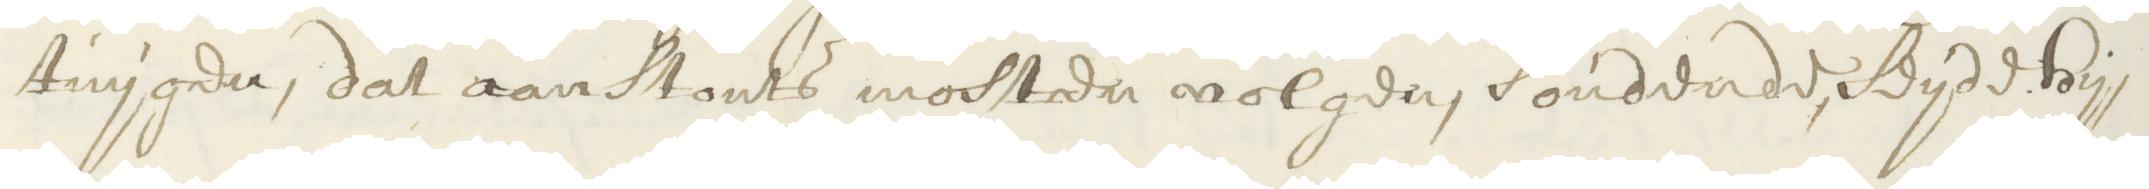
tuijgen, dat aanstonts mosten volgen, soudende, seijde hij,
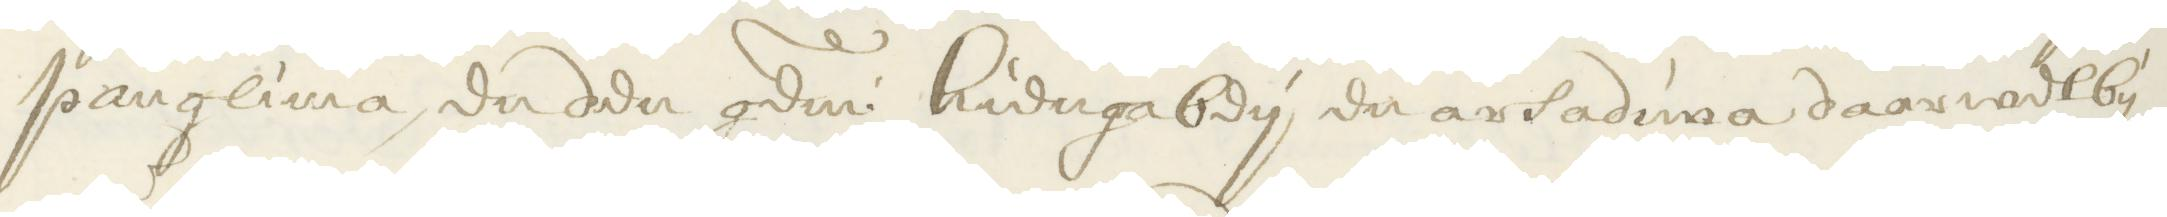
panglima, en den gem: kiengabeij en arsadiwa daar wel bij
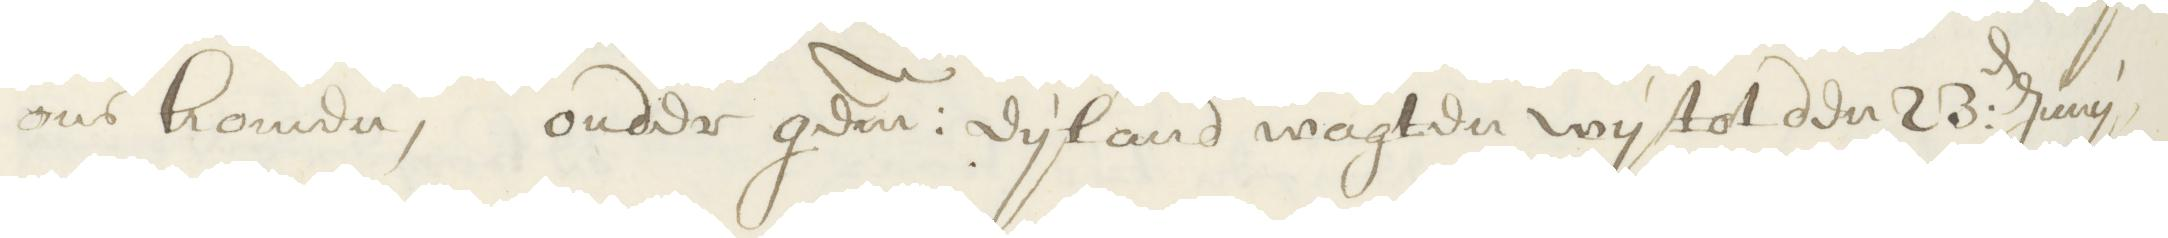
ons komen; onder gem: eijland wagten wij tot den 23:en Junij
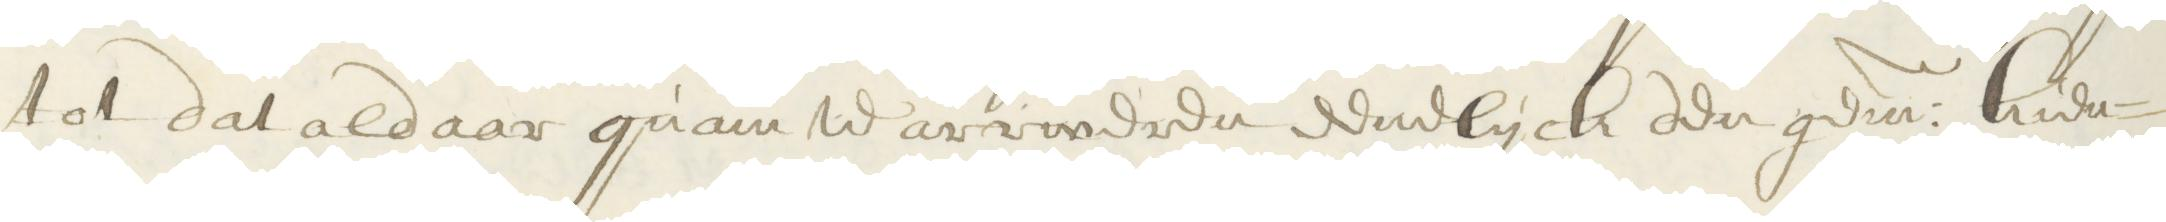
tot dat aldaar quam te arriveren eenelijck den gem: kien=
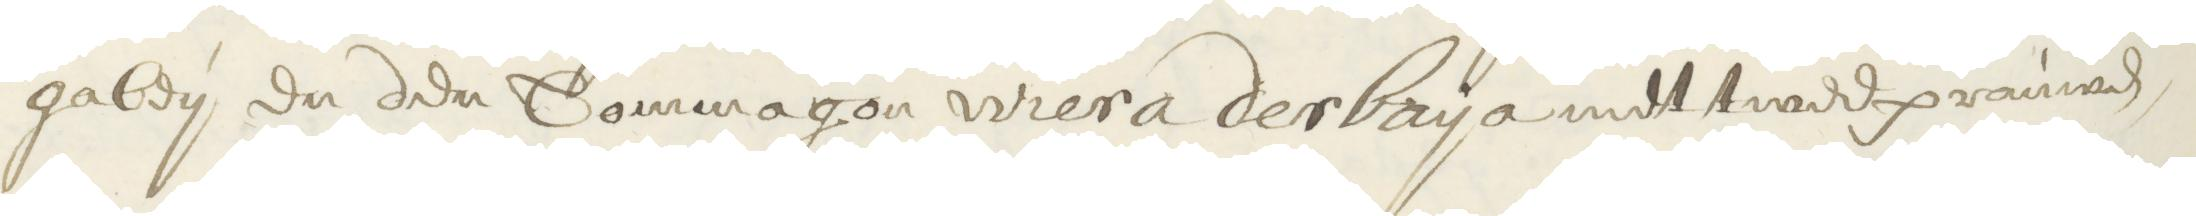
gabeij en den Tommagon wiera derbaija met twee prauwen,
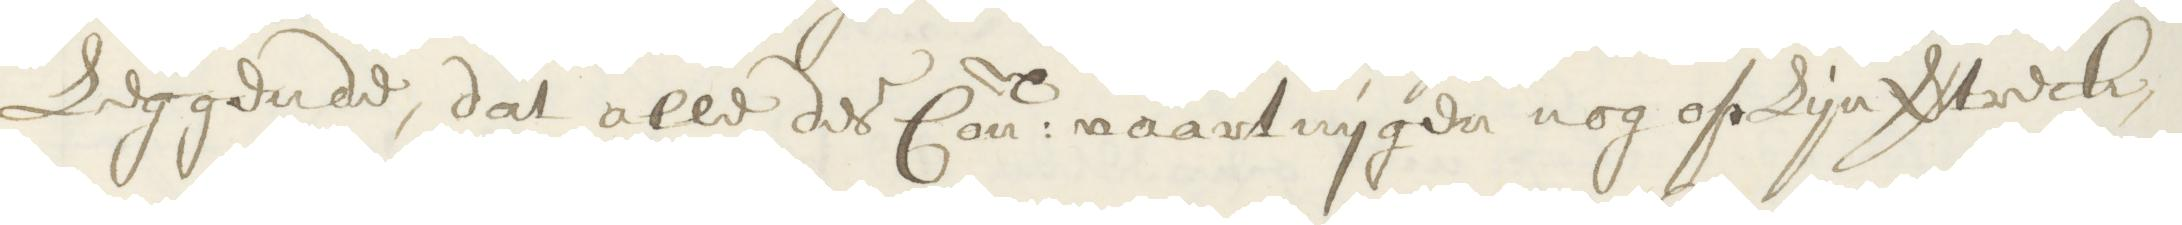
zeggende, dat alle des Con:x vaartuijgen nog op zijn vertreck,
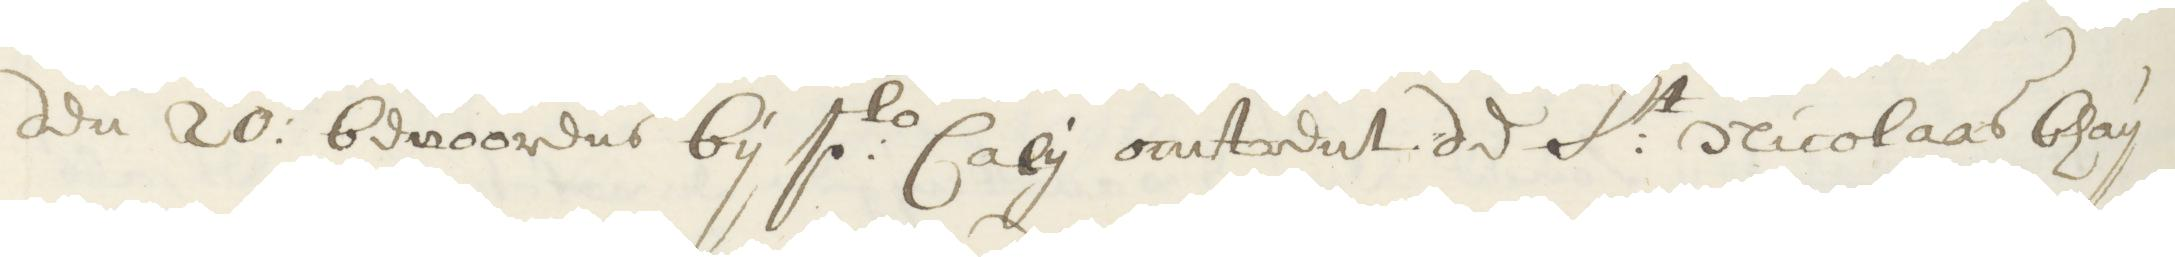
den 20:en bevoorens bij p:lo Calij omtrent de S:t Nicolaas Chaij
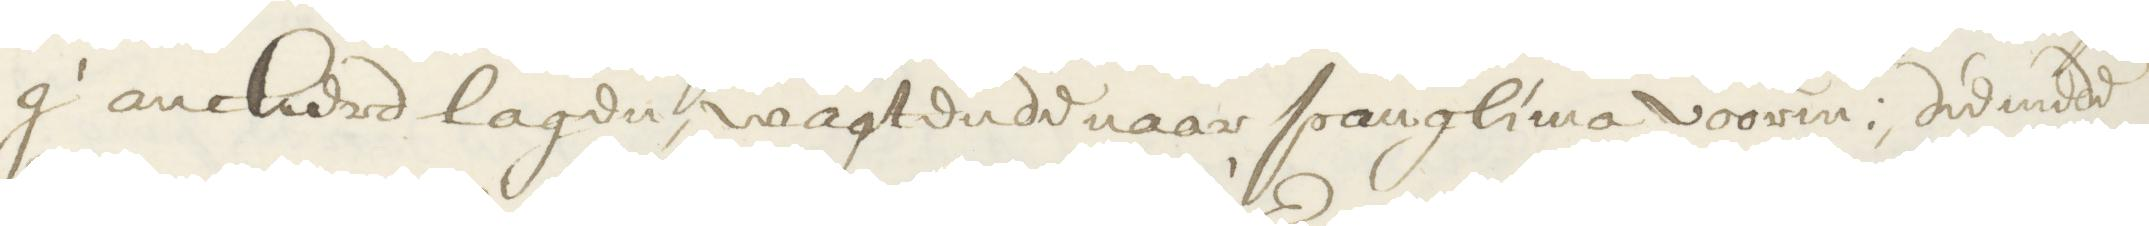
g’anckerd lagen, wagt ende naar panglima voorm:lt, die mede
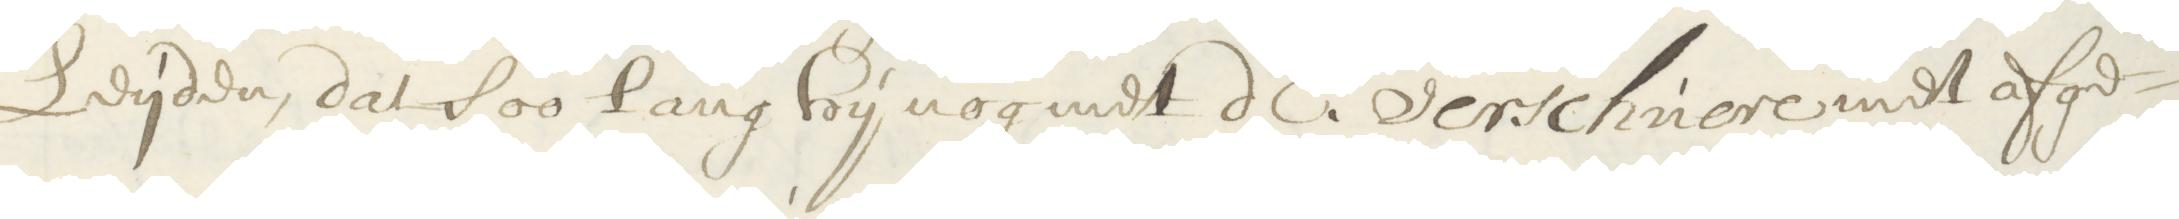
zeijden, dat soo lang hij nog met d'E. verschuere niet afge=
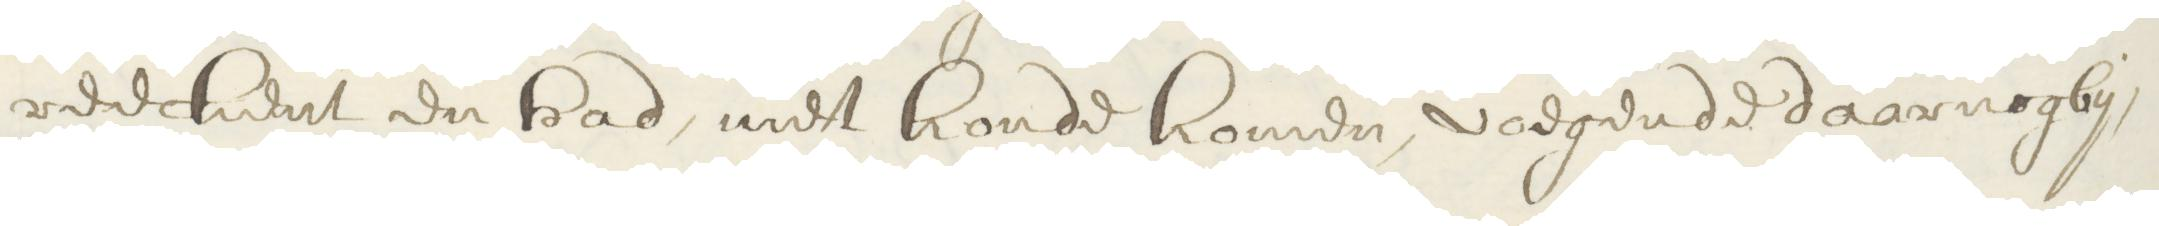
reeckent en had, niet konde komen, voegende daar nog bij,
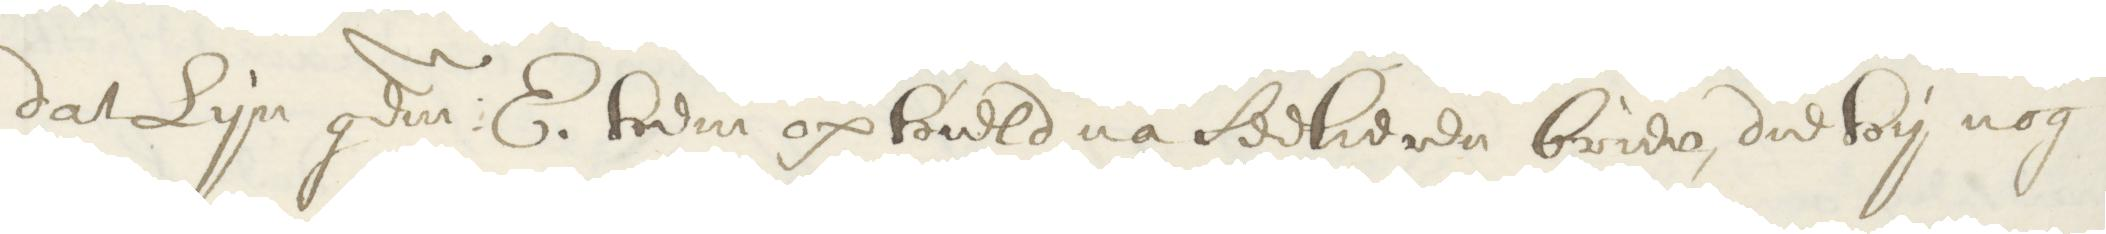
dat zijn gem: E. hem op hield na seekeren briev, die hij nog
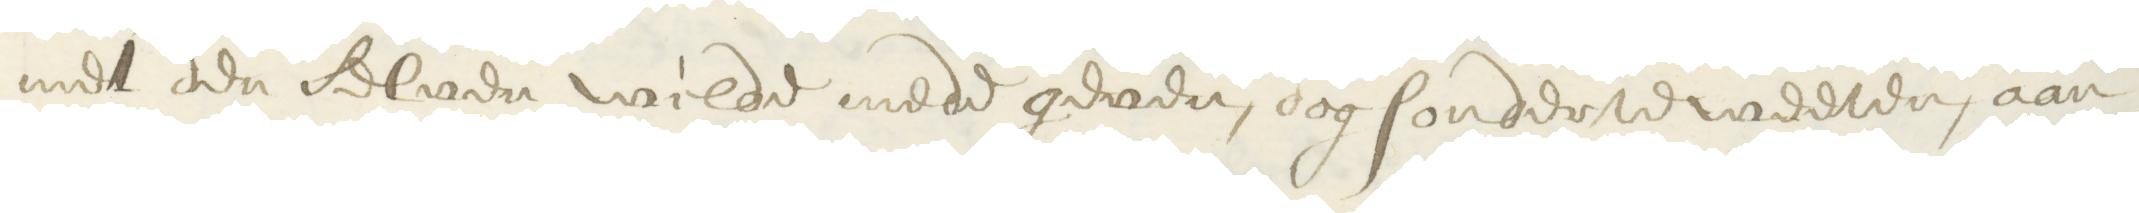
met den selven wilde mede geven, dog sonder te weeten, aan
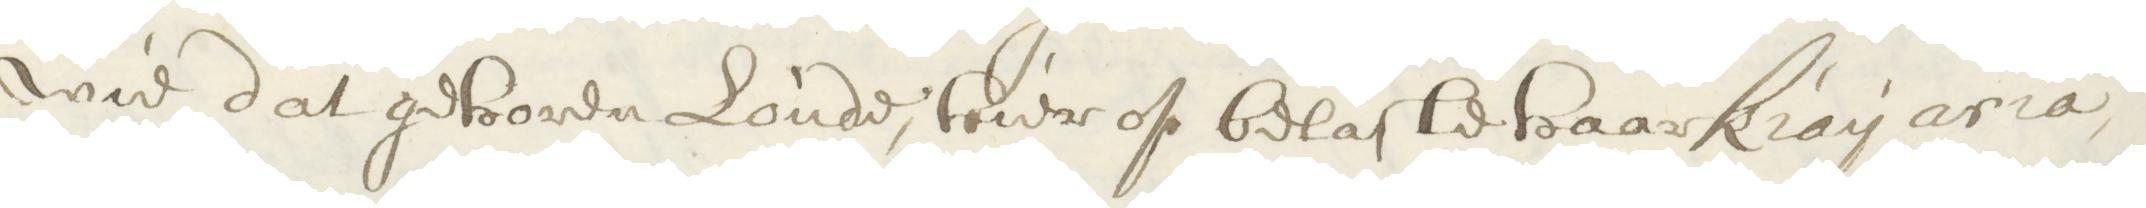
wie dat gehoren zoude, hier op belaste haar kiaij aria,
